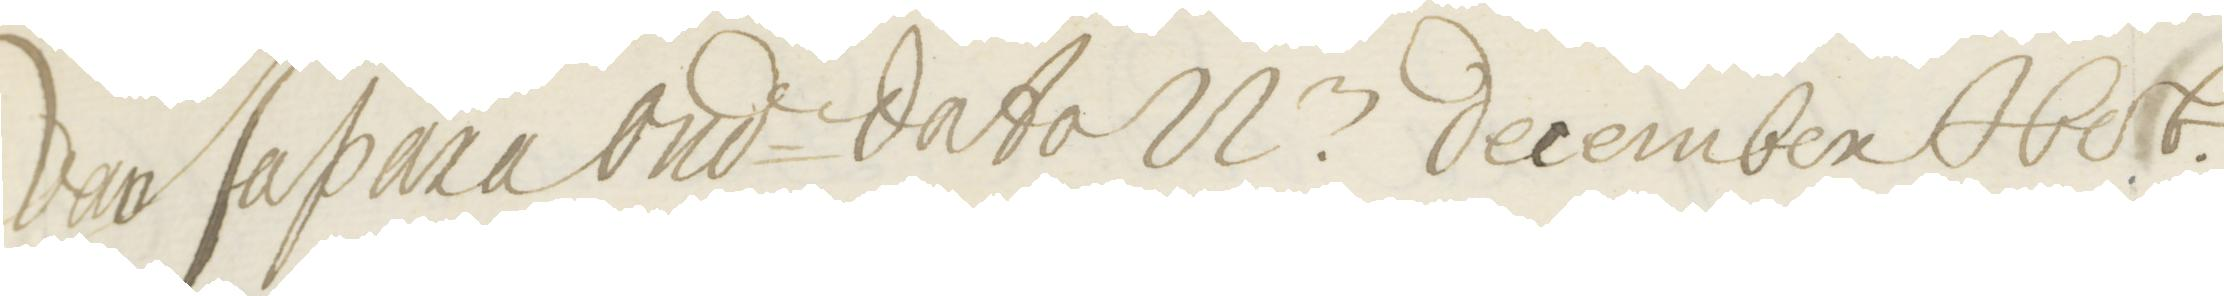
Van Japara ond= dato 22:' december 1686.
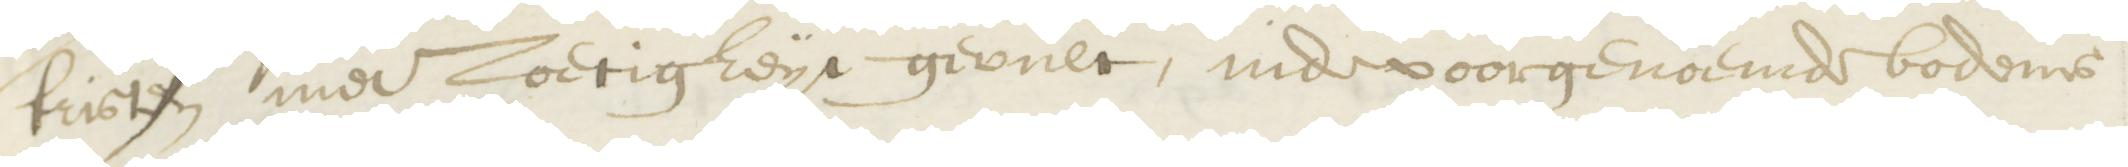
kisten met zoetigheijt gevult, inde voorgenoemde bodems
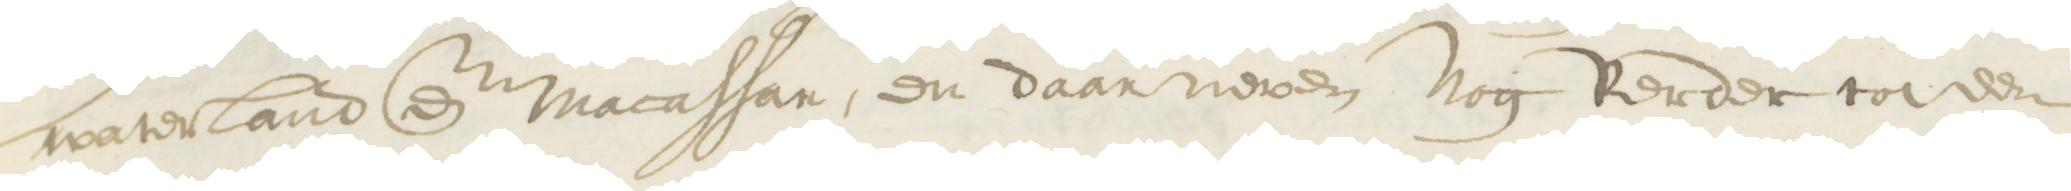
waterland en macassar, en daarneven nog verder tot een
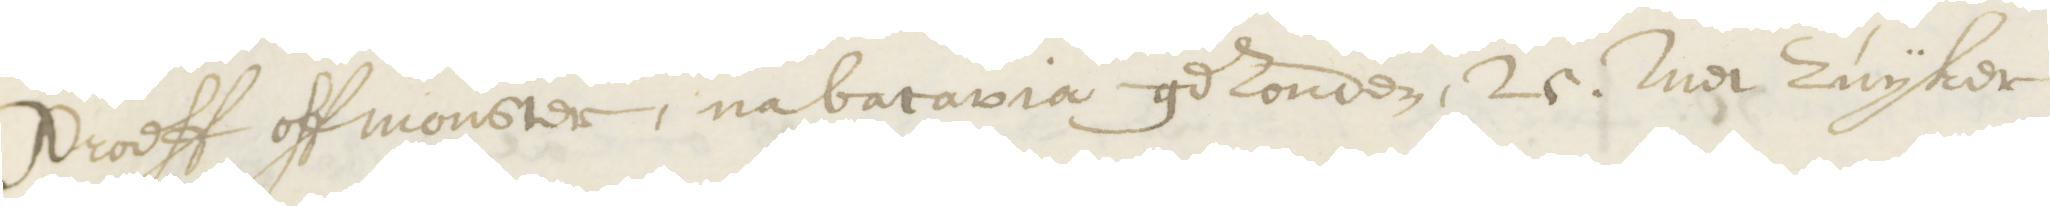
Proeff off monster, na batavia gezonden, 25. met zuijker
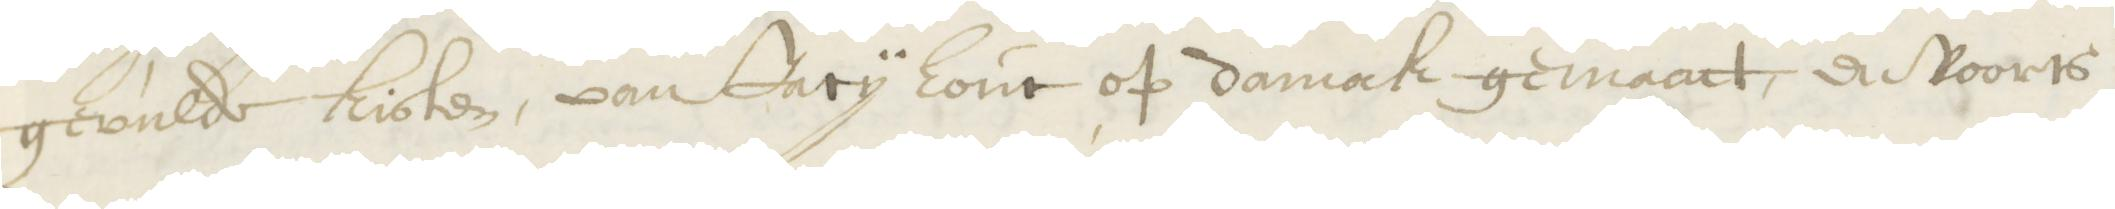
gevulde kisten, van Iatij hout op damak gemaact, en voorts
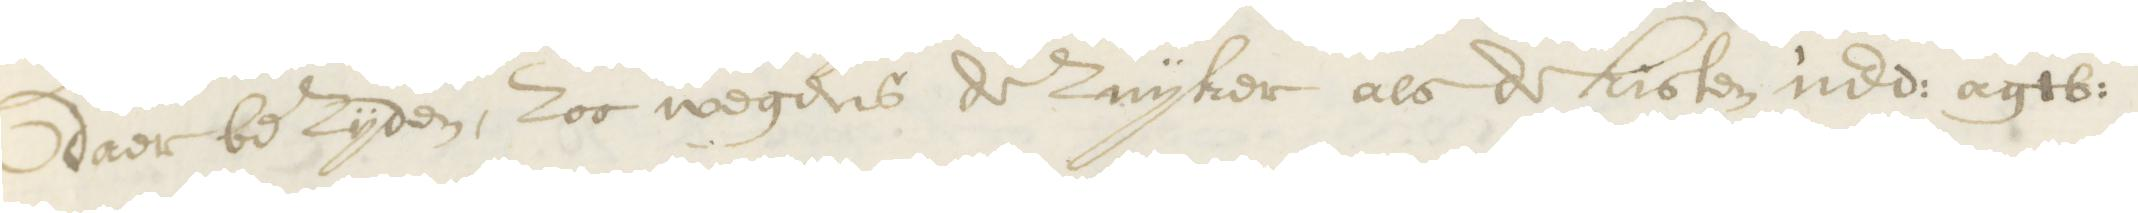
daer bezijden, zoo wegens de zuijker als de kisten uEd: agtb:
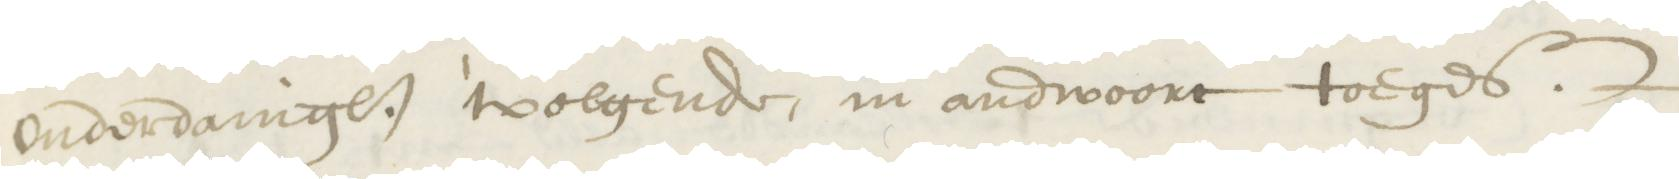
onderdaniglijk 'tvolgende, in andwoort toegest.
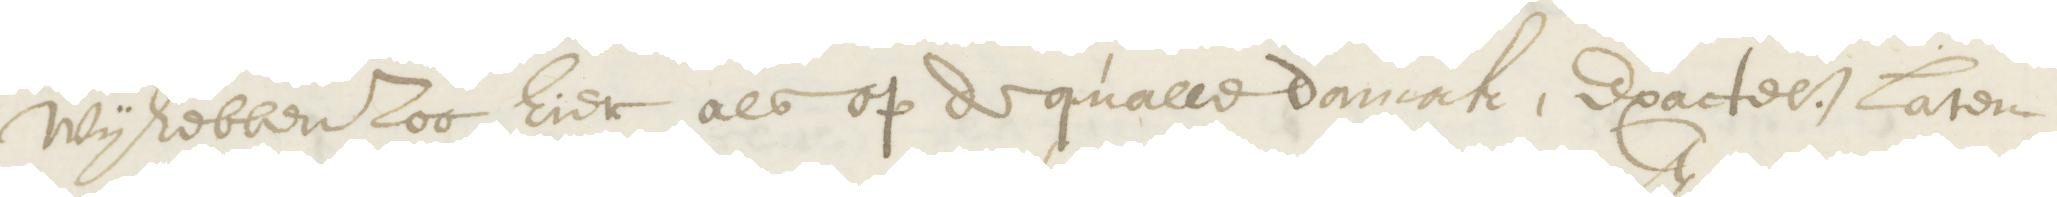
wij hebben zoo hier als op de qualle damak, Exactelijk laten
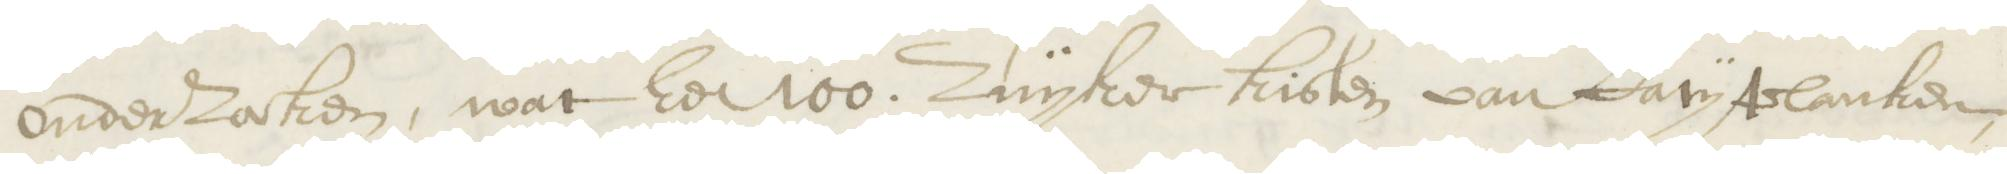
onderzoeken, wat het 100. zuijker kisten van Iatijplanken,
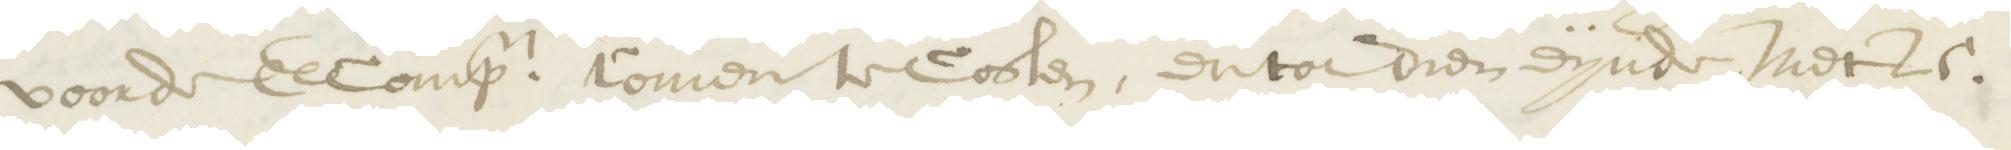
voorde EeComp.s comen te costen, en tot dien eijnde met 25.
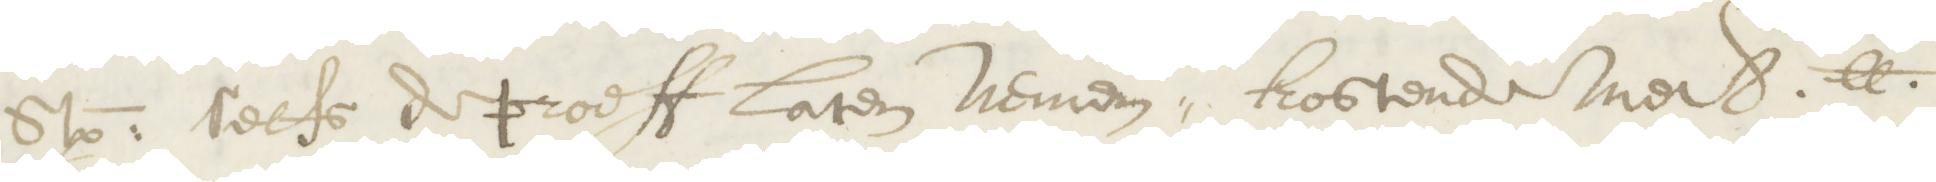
stx: selfs de proeff laten nemen„ kostende met 8. lb.
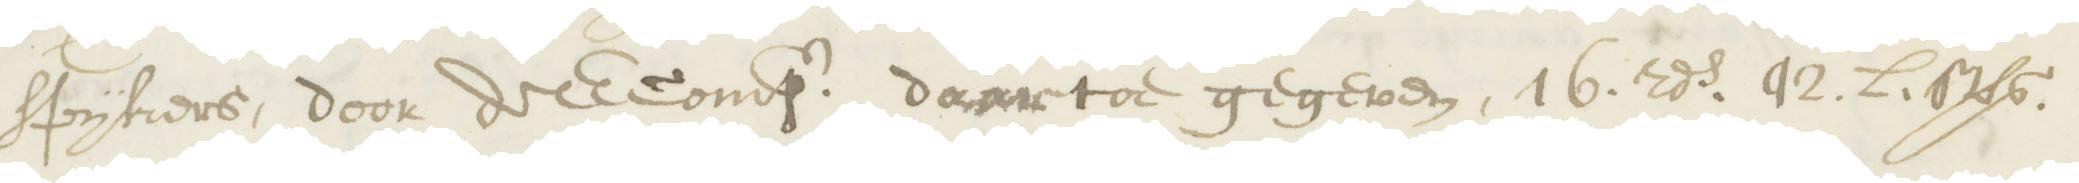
spijkers, door de EComp.s daartoe gegeven, 16. rd.s 42. l. stvers.
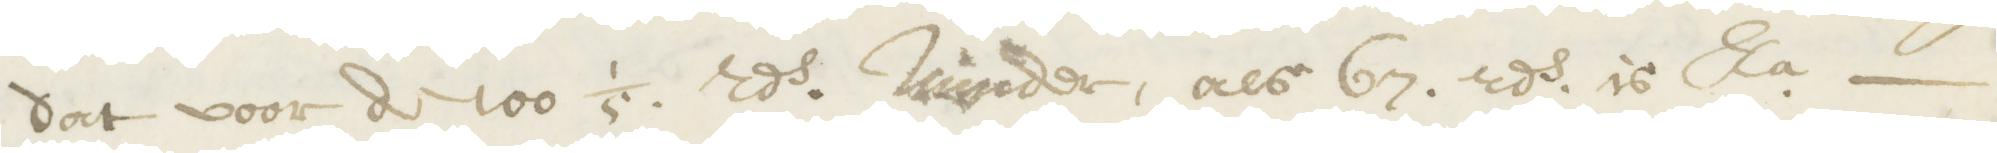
dat voor de 100 1/5. rd.s minder, als 67. rd.s is etc.a
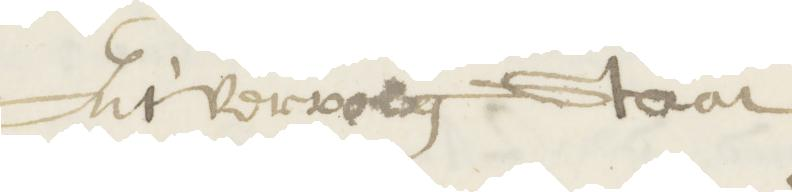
Int' vervolg staat
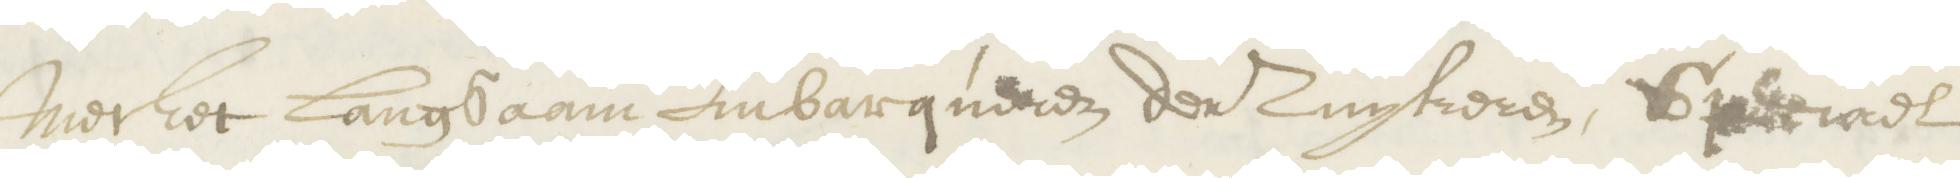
Met het langsaam Imbarqueren der zuijkeren, speciael
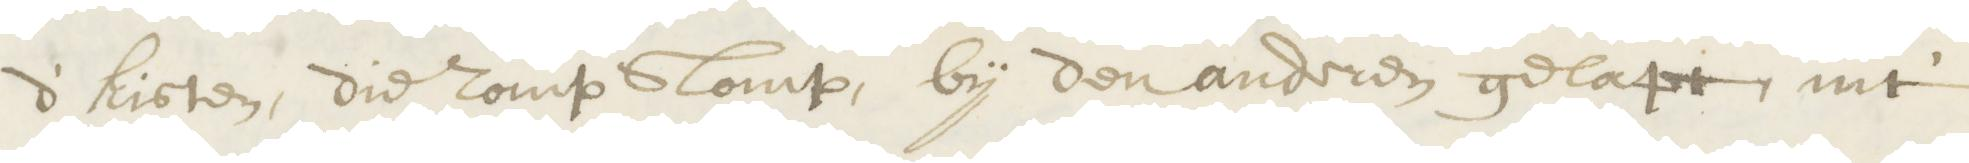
d’ kisten, die romp slomp, bij den anderen gelapt, int'
